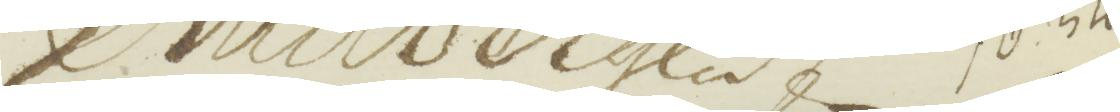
Santbergen f ƒ6.34
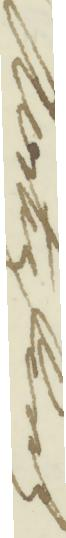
dertig cents
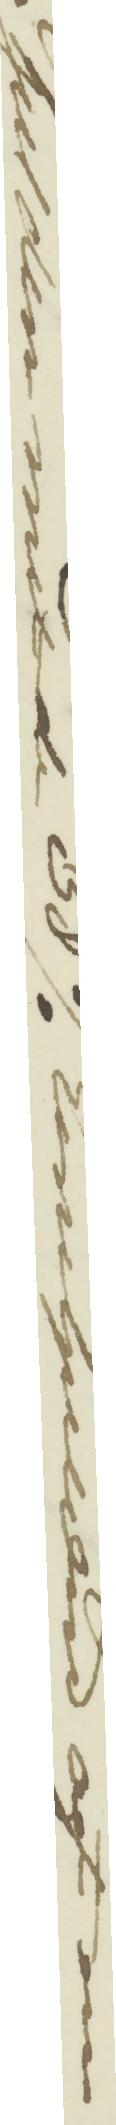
Gulden met de 38% Eene gulden agt en
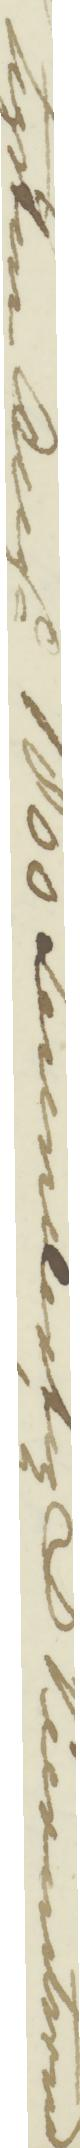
tigsten Aug=t 1800 Zesendertig D Vierentwin
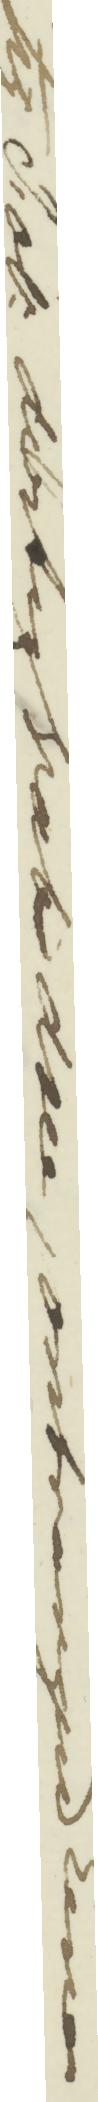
tig Fol.i dertig vak drie, ontvangen Eenen
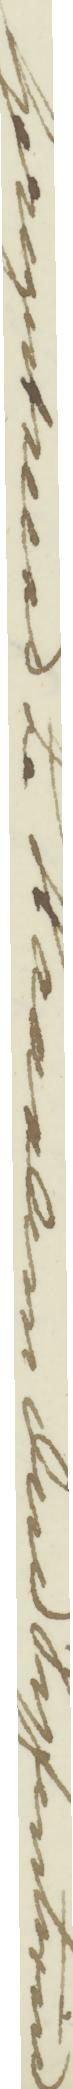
Geregistreerd te Haarlem den Vyfentwin
